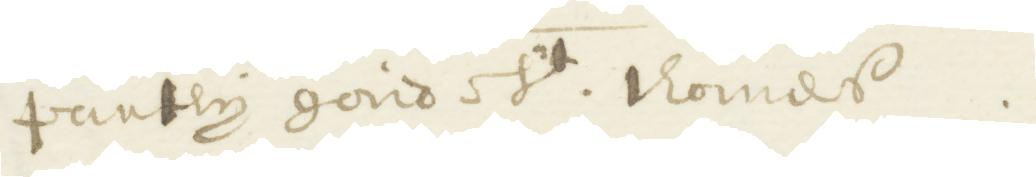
parthij goud s.t thomas
